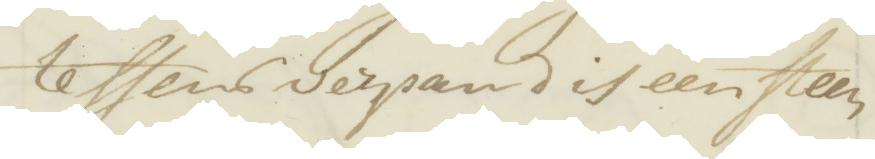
teffens verpand is een steen
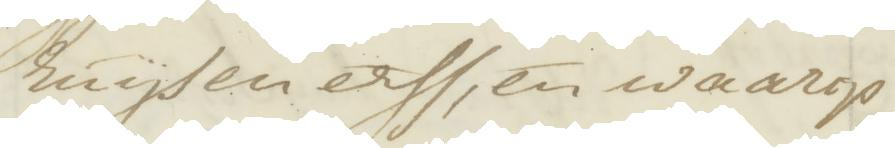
huijs en erff, en waarop
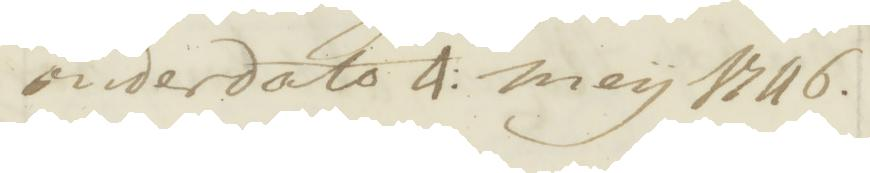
onderdato 4: meij 1746.
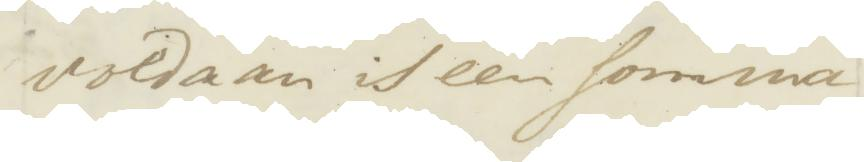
voldaan is een somma
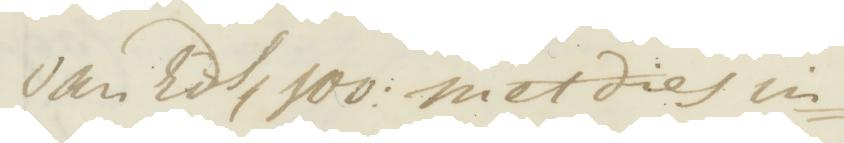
van rd„s 100: met dies in=
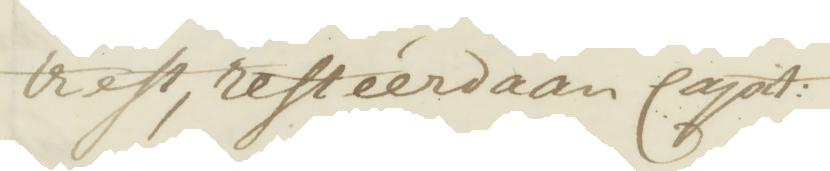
trest, resteerd aan Capit:
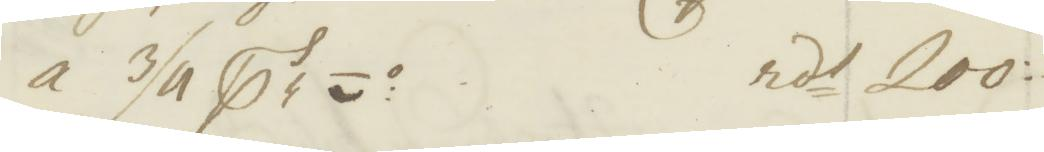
a ¾ p„s =:o rd=s 200:
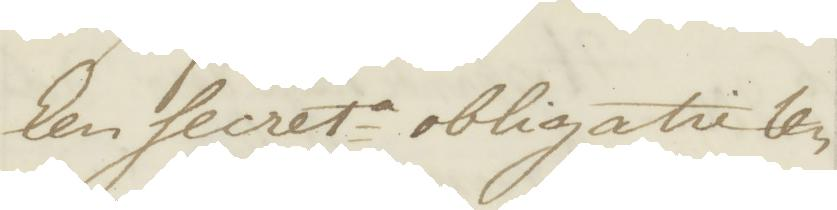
Een secret=n obligatie ten
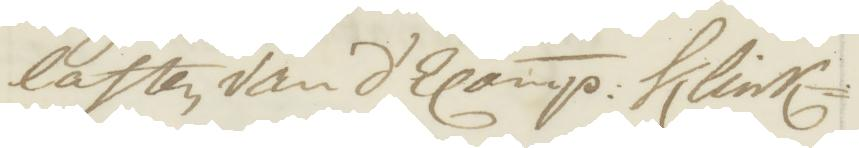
lasten van d’ EComp: klink=
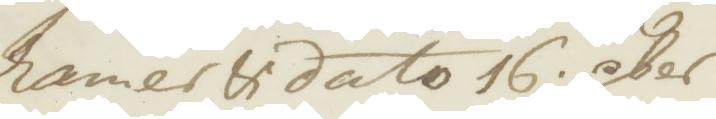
hamer & dato 16. xber
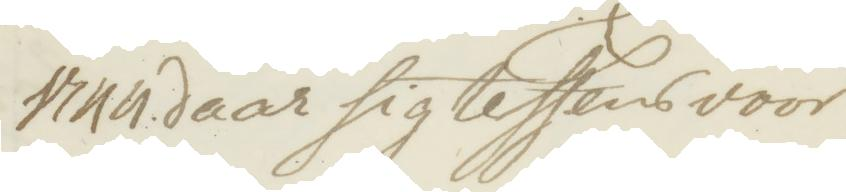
1744. daar sig teffens voor
